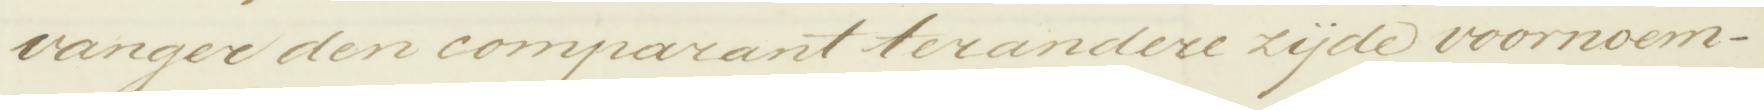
vanger den comparant ter andere zijde voornoem-
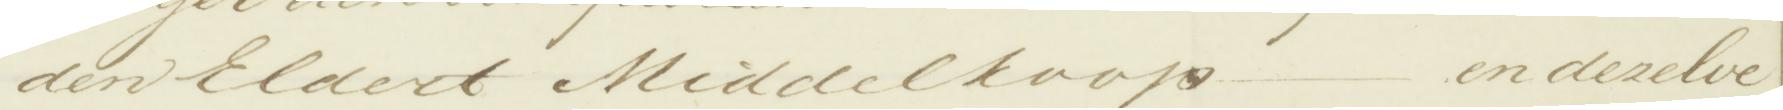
den Eldert Middelkoop en dezelve
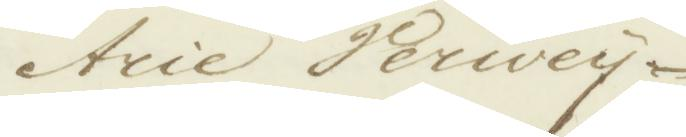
Arie Verweij._
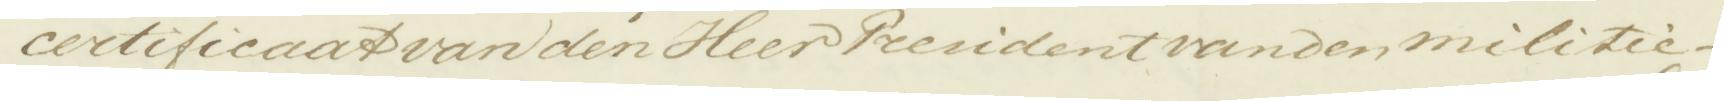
certificaat van den Heer President van den militie-
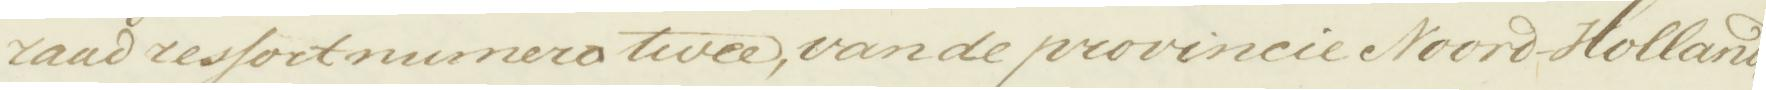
raad ressort numero twee, van de provincie Noord-Holland,
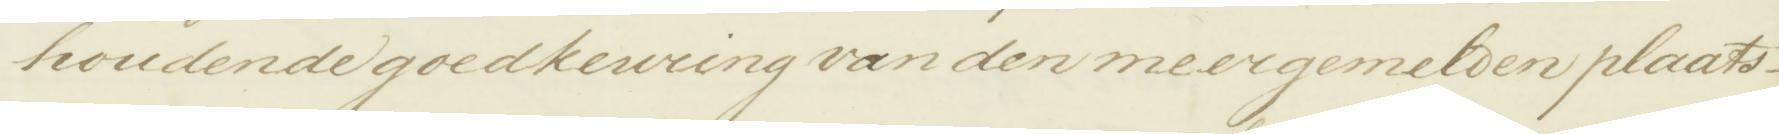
houdende goedkeuring van den meergemelden plaats-
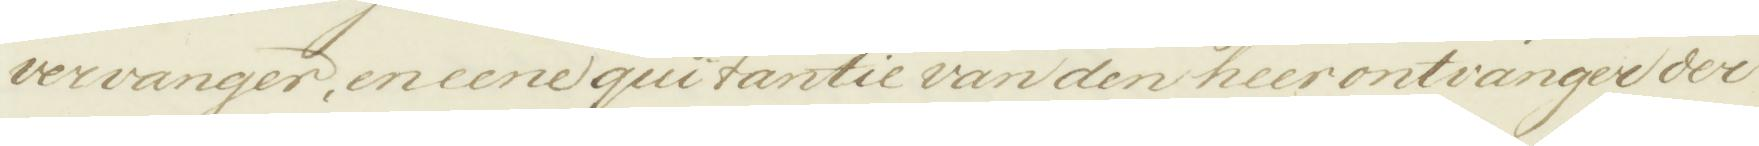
vervanger, en eene quitantie van den heer ontvanger der
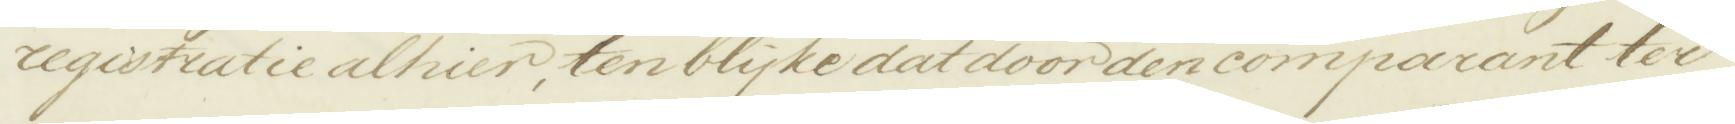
registratie alhier, ten blijke dat door den comparant ter
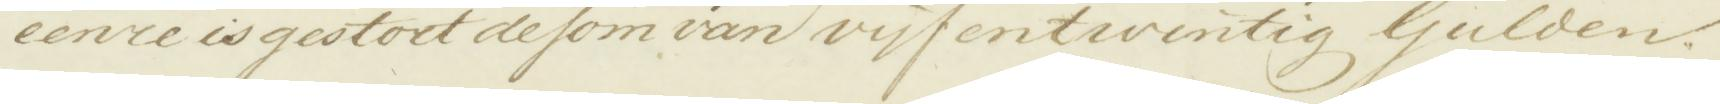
eenre is gestort de som van vijf en twintig Gulden.
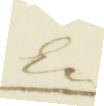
Er
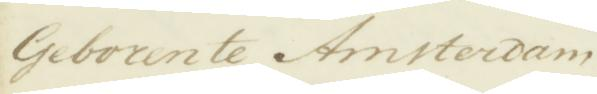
Geborente Amsterdam
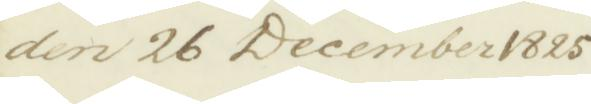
den 26 December 1825
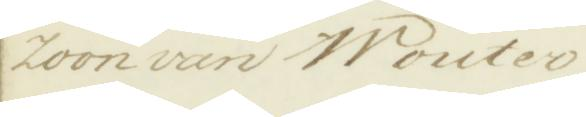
zoon van Wouter
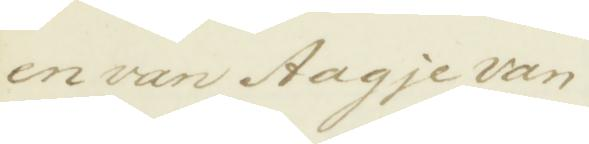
en van Aagje van
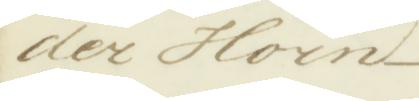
der Horn
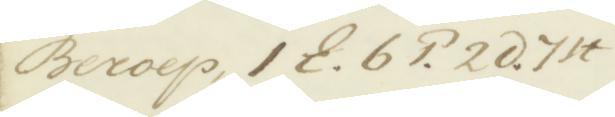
Beroep, 1 E. 6P. 2d. 7st
